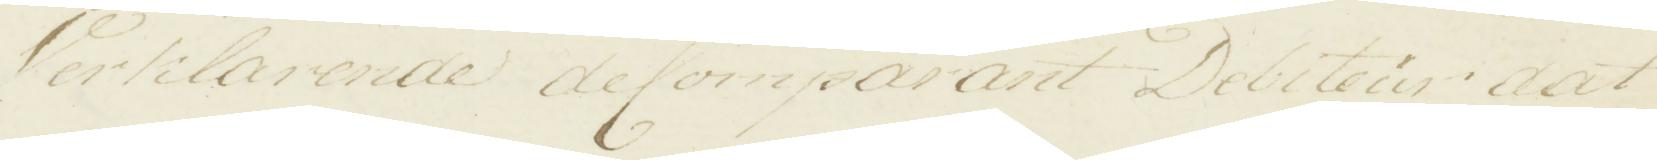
Verklarende de Comparant Debiteur dat
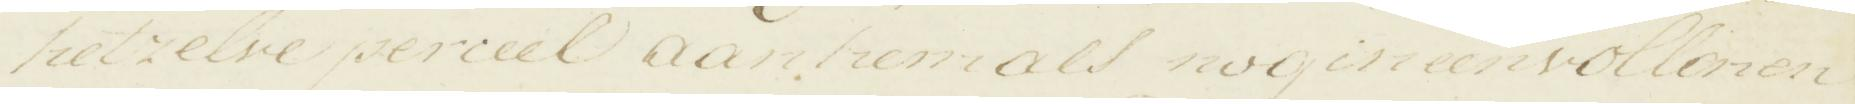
hetzelve perceel aan hem als nog in een vollen en
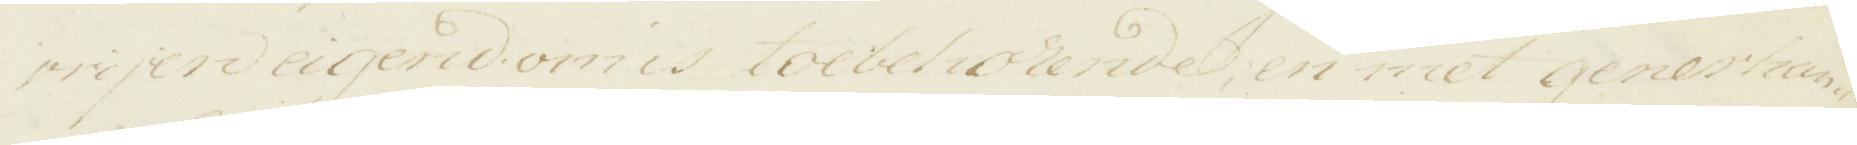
vrijen eigendom is toebehorende, en met generhan„
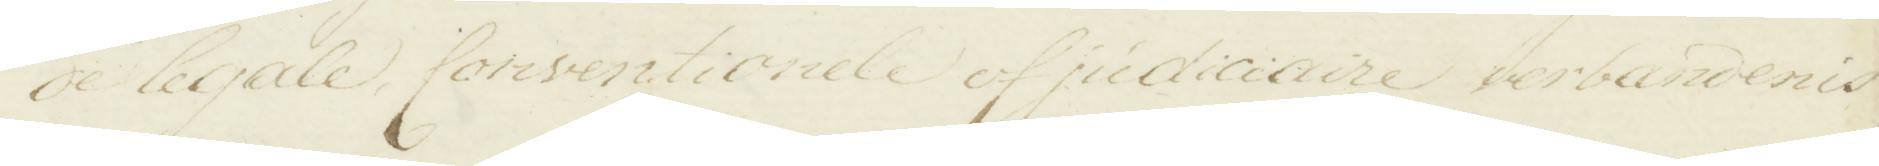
de legale, Conventionele of judiciaire verbanden is
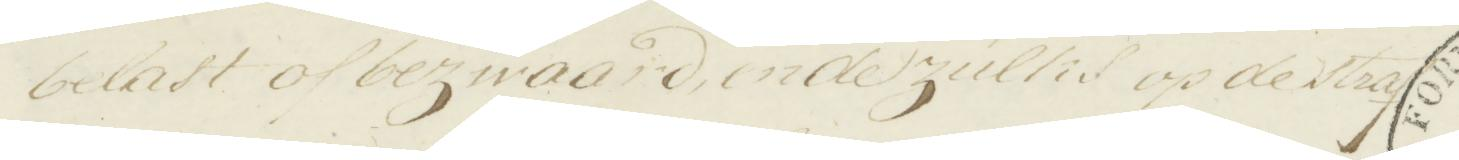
belast of bezwaard, en de zulks op de straf
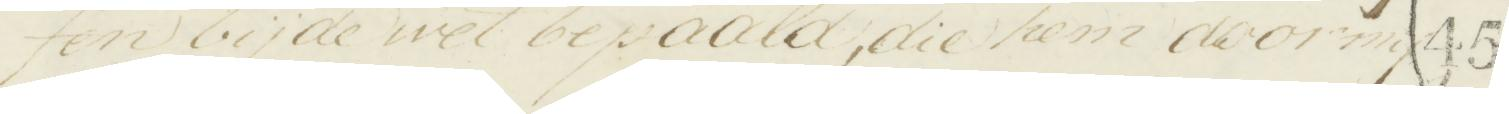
fen bij de wet bepaald, die hem door my
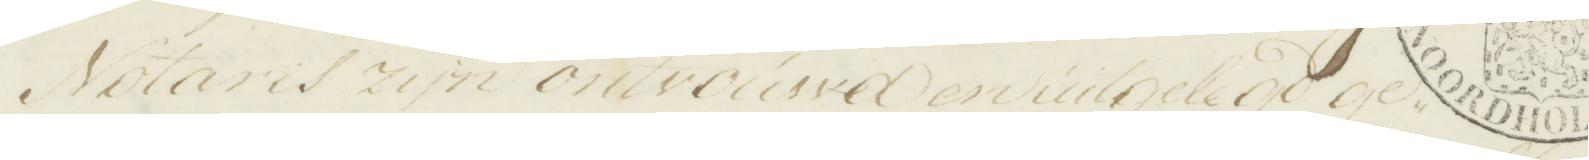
Notaris zijn ontvouwd en uitgelegd ge„
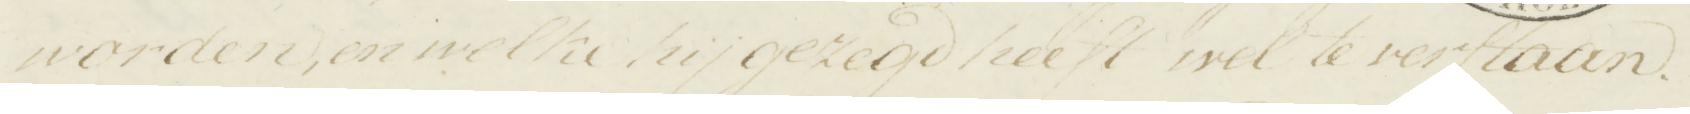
worden, en welke hij gezegd heeft wel te verstaan.
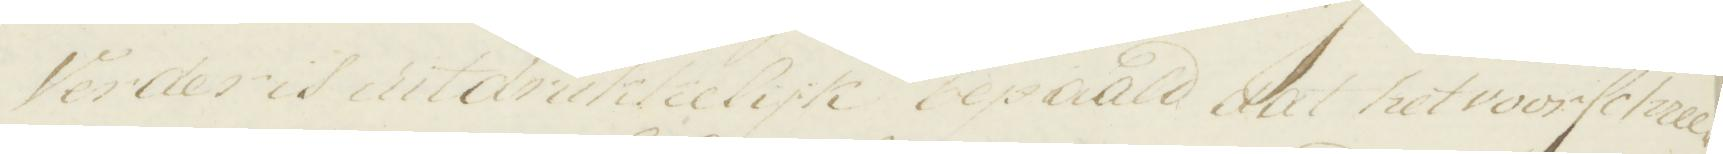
Verder is uitdrukkelijk bepaald dat het voorschree
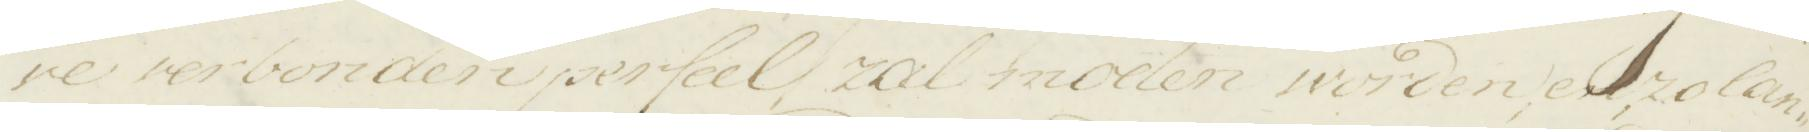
ve verbonden perceel zal moeten worden, en, zolan
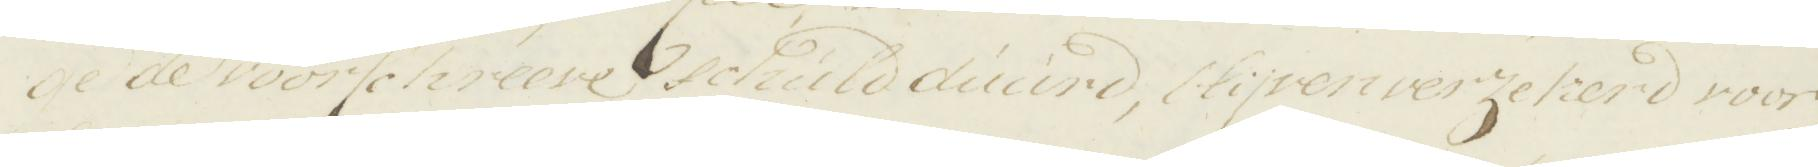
ge de voorschreeve schuld duurd, blijven verzekerd voor
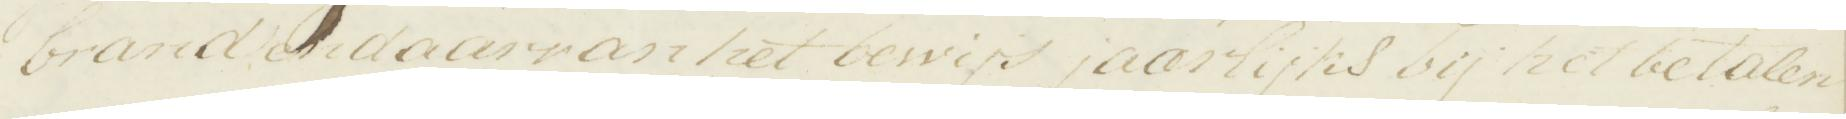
brand en daarvan het bewijs jaarlijks bij het betalen
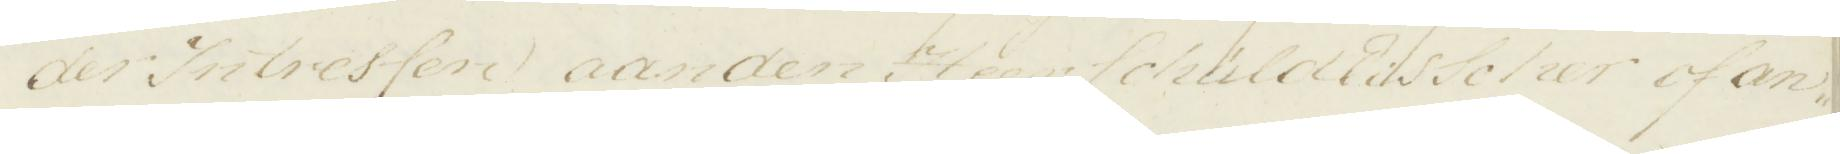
der Jntressen aan den Heer schuldeisscher of an„
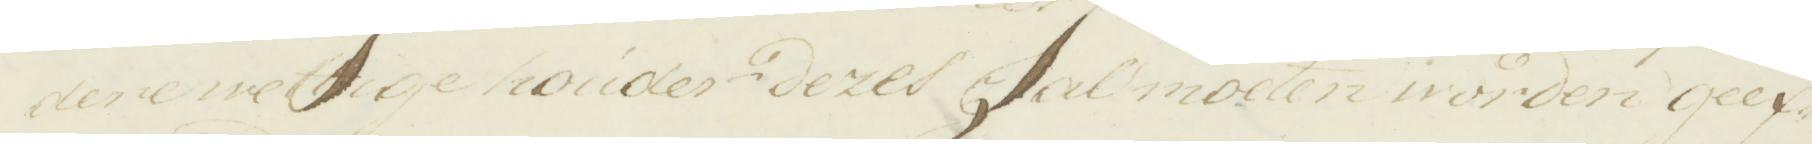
dere wettige houder dezes zal moeten worden geex„
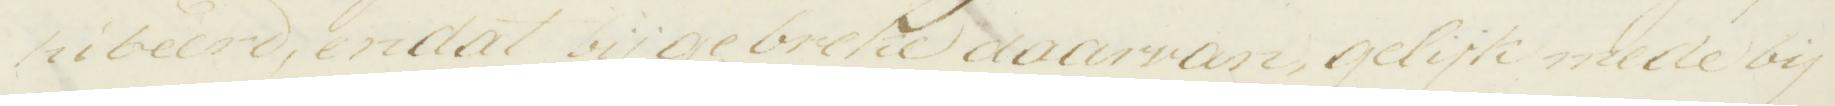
hibeerd, en dat zij gebreke daarvan, gelijk mede bij
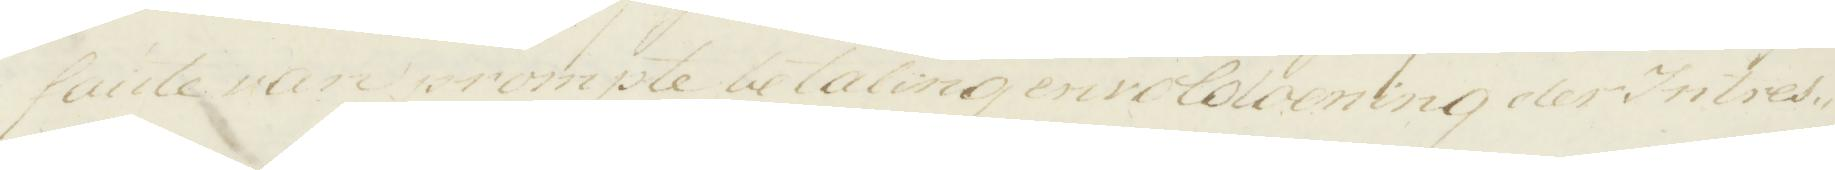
faute van prompte betaling, en voldoening der Intres„
